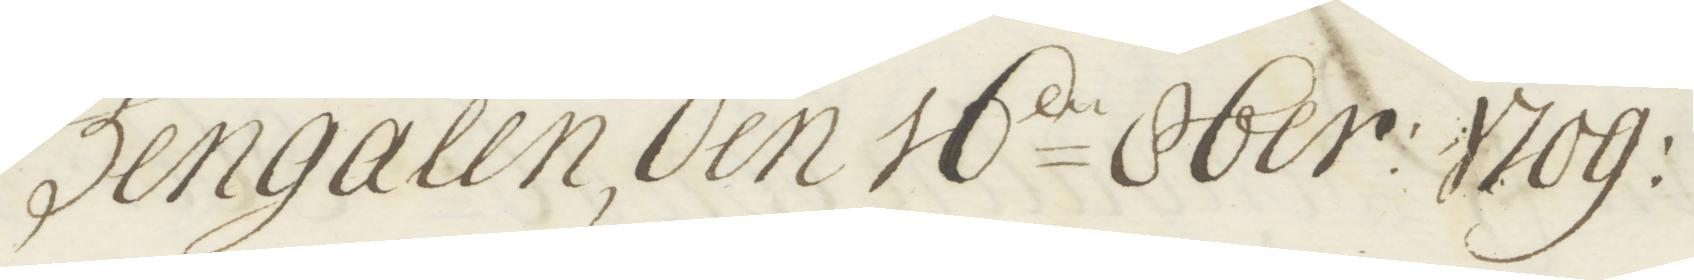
Van Bengalen, den 16=en 8ber: 1709:
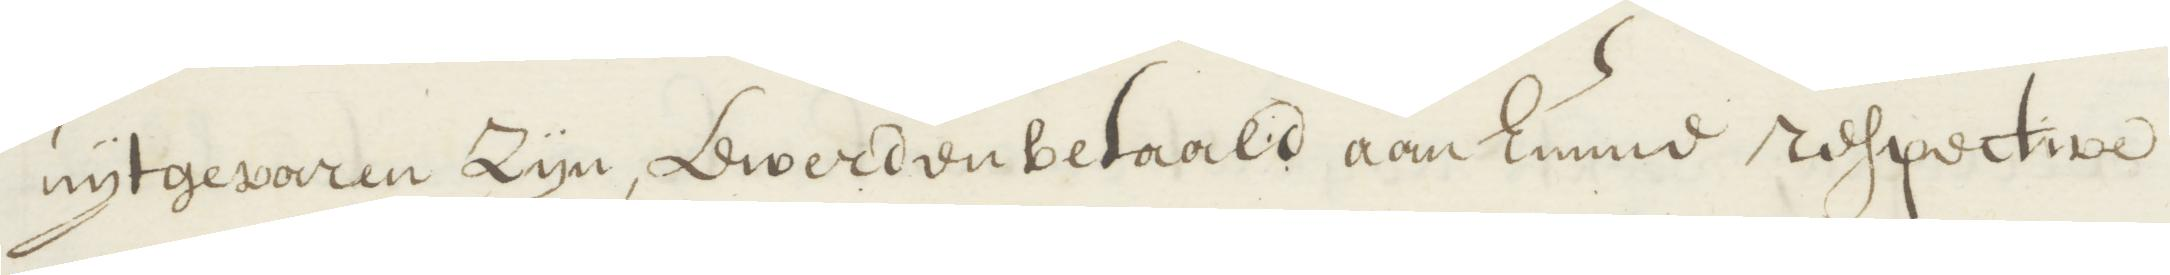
uijtgevaren zijn, tewerden betaald aan hunne respective
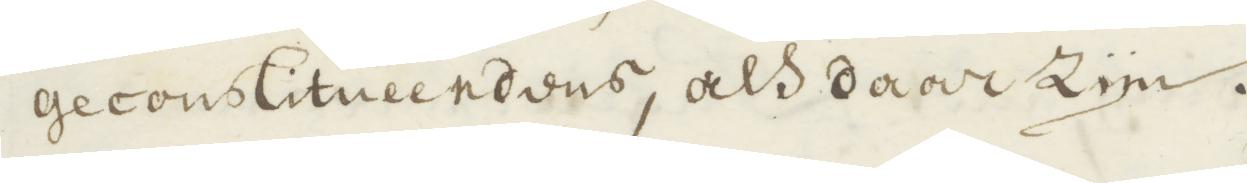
geconstitueerdens, als daar zijn.
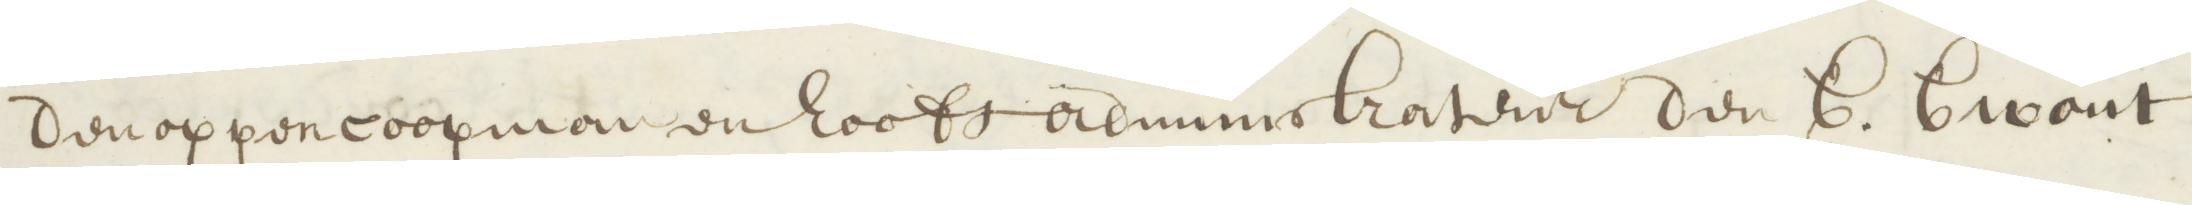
den oppercoopman en hooft administrateur den E. Ewout
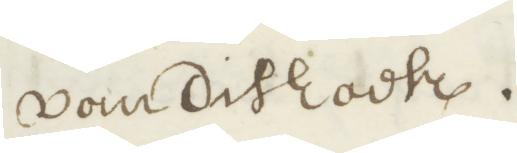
van dishoek.
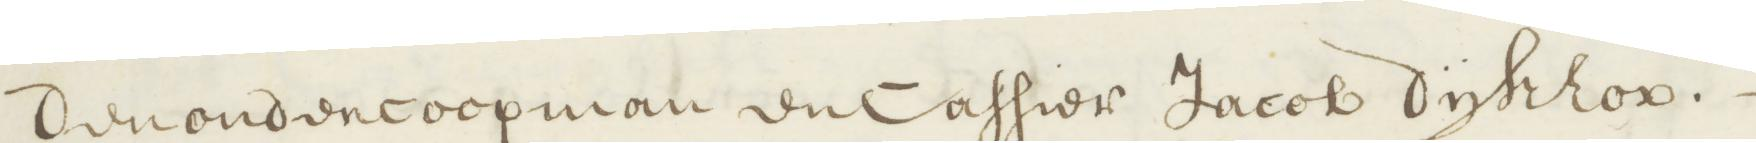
den ondercoopman en Cassier Iacob Dijkhop.
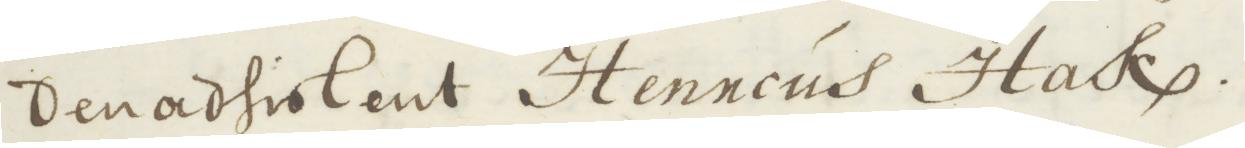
den adsistent Henrcus Hak.
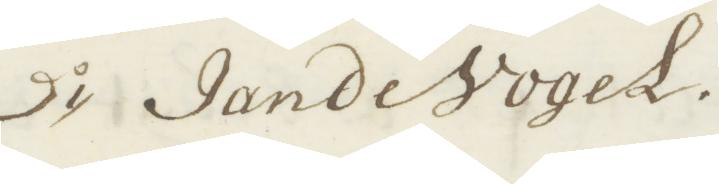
d„o Ian de Vogel.
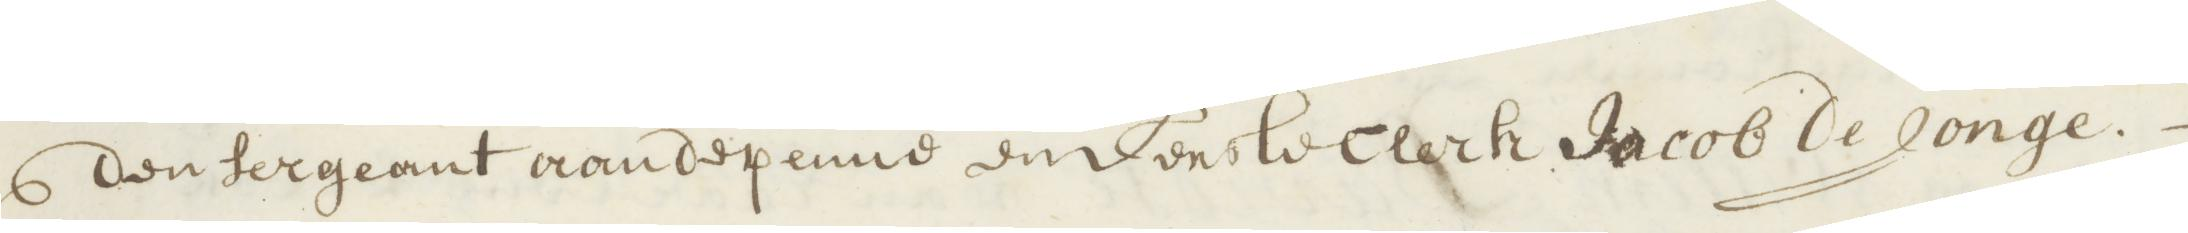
den sergeant aan de penne en Eerste clerk Iacob de Jonge.
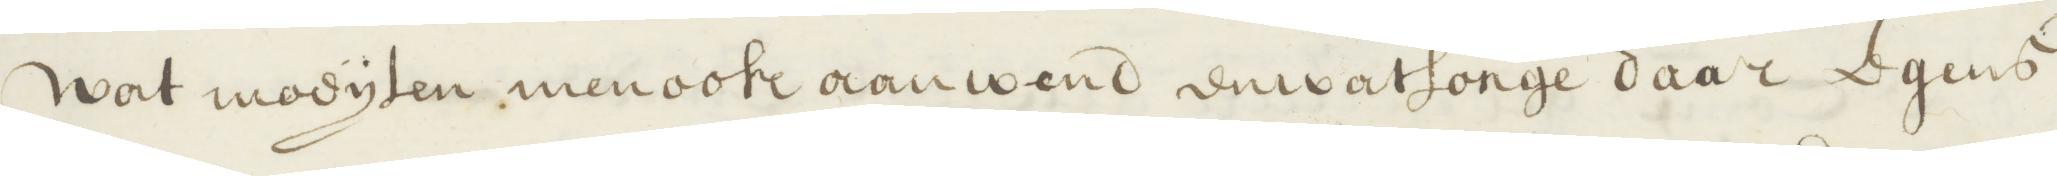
wat moeijten men ook aan wend en wat sorge daar tegens
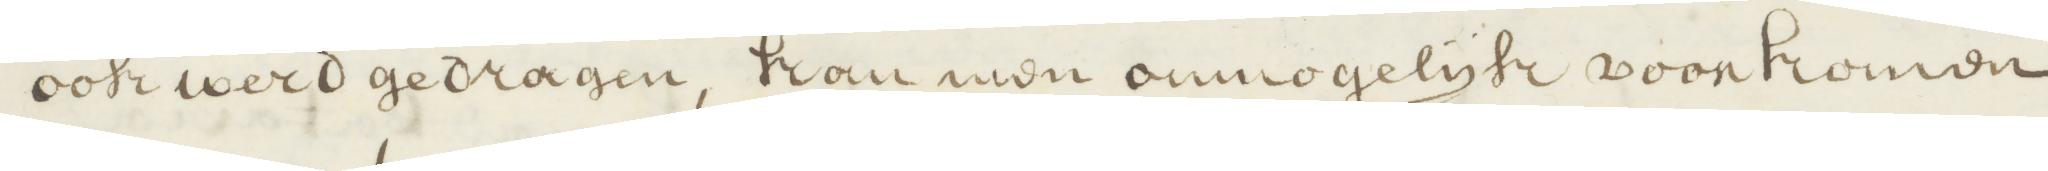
ook werd gedragen, kan men ommogelijk voor komen
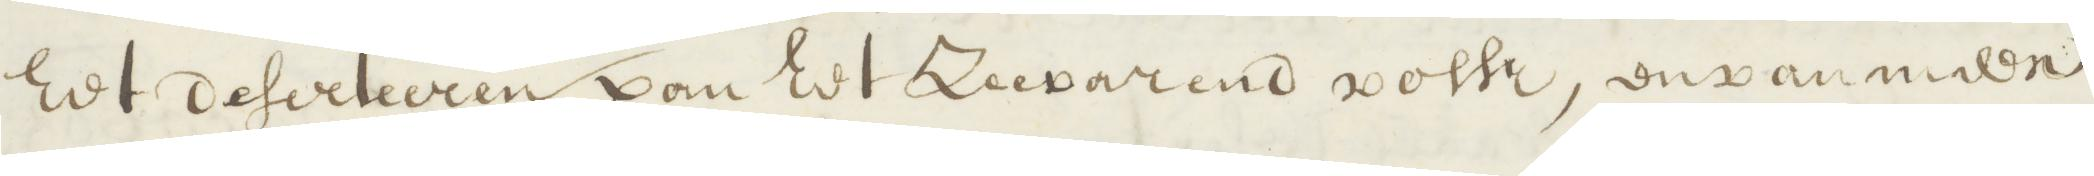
het deserteeren van het zeevarend volk, en van meer
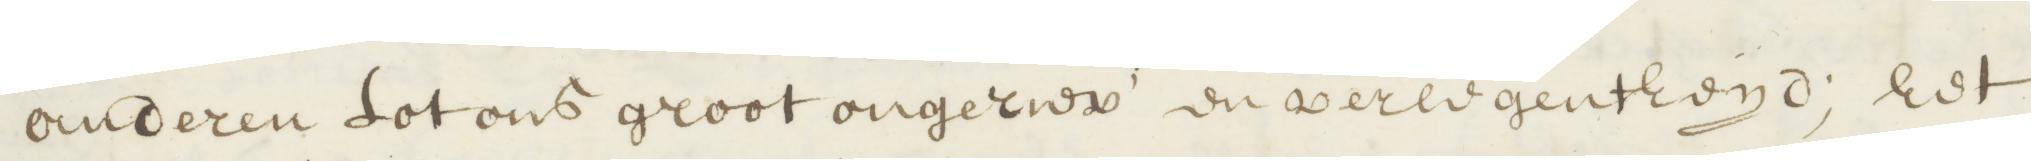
anderen tot ons groot ongeriev' en verlegentheijd; het
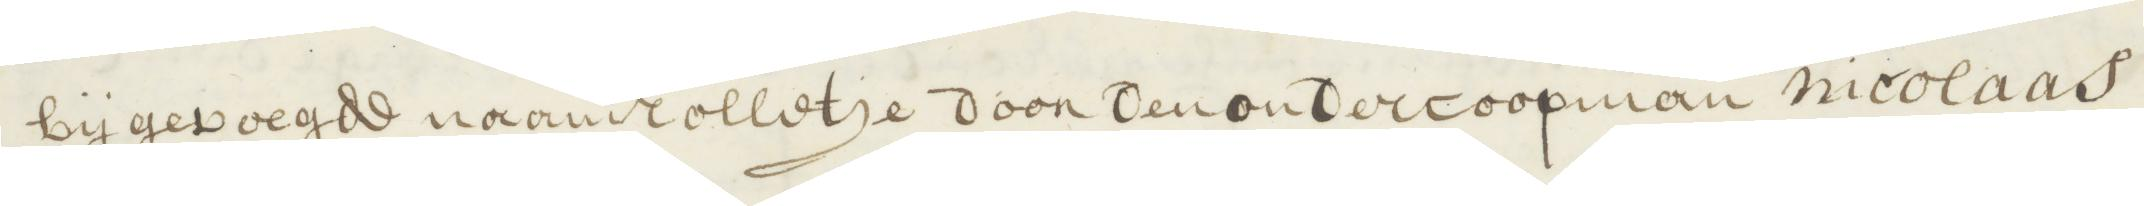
bij gevoegde naamrolletje door den ondercoopman nicolaas
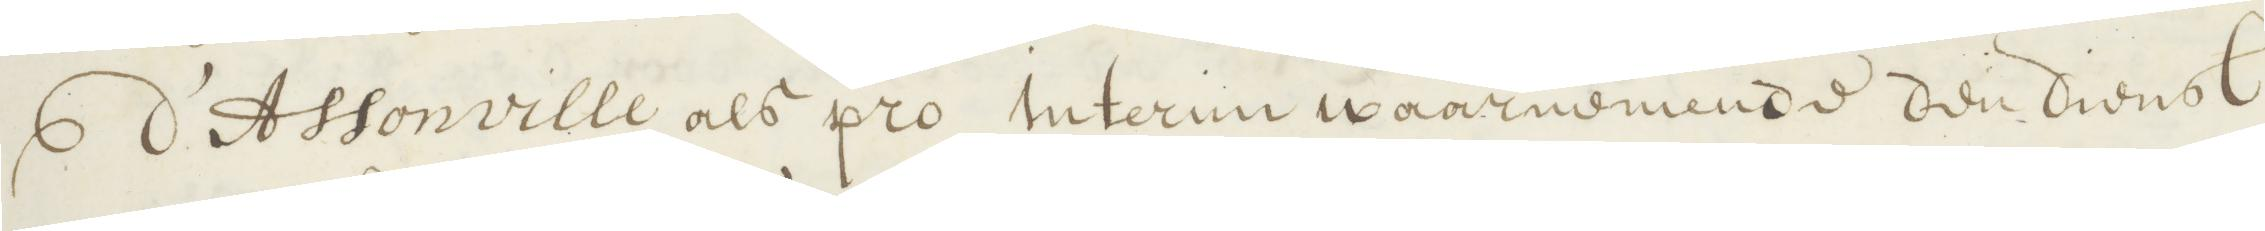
d’ Assonville als pro interim waarnemende den dienst
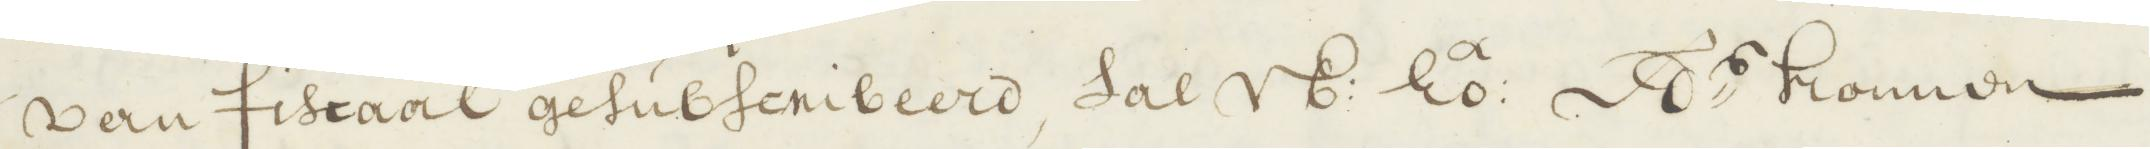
van fiscaal gesubscribeerd, sal VE: ho: Ed„s konnen
